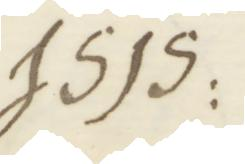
1515:
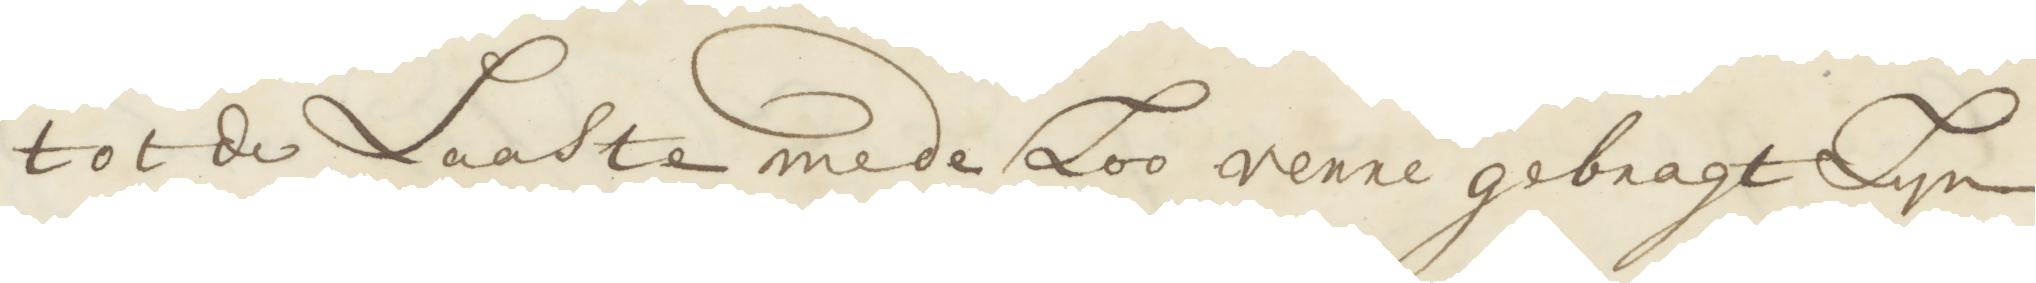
tot de Laaste mede zoo verre gebragt zijn
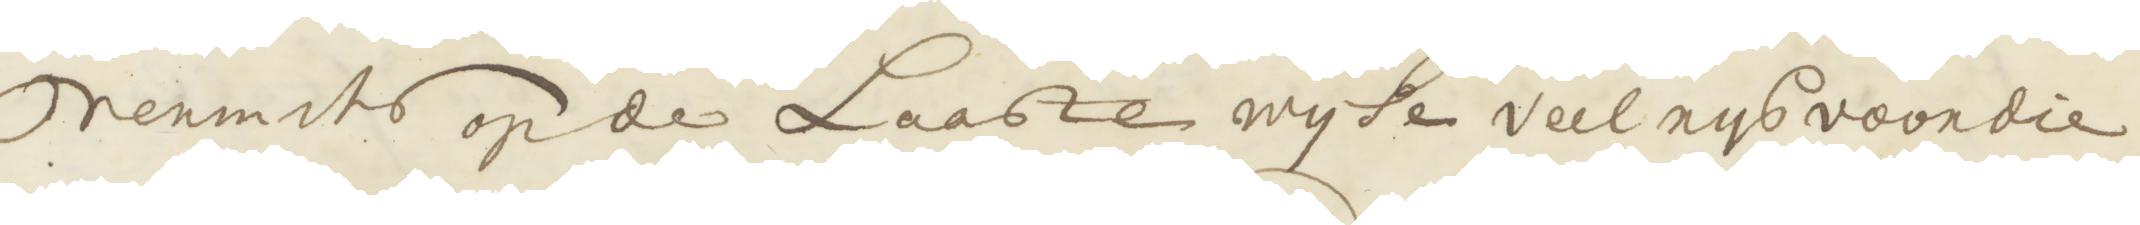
vermits op de Laaste wyse veel rijs voor die
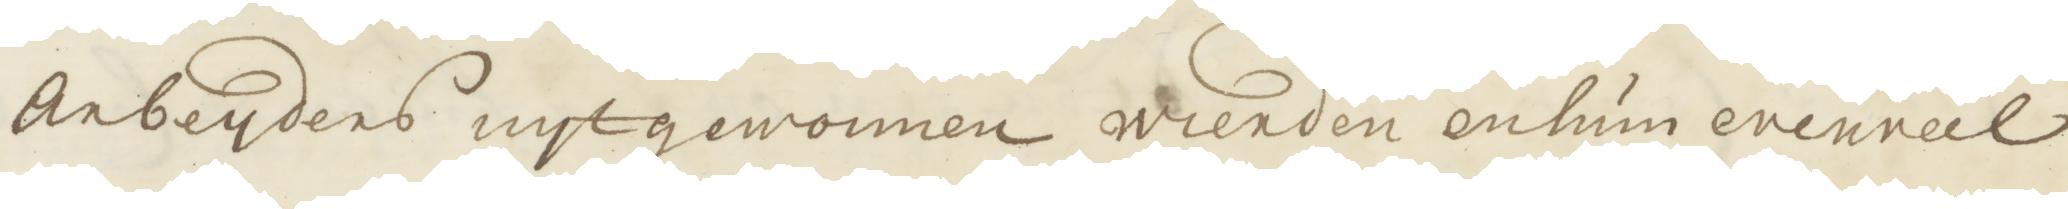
arbeyders uytgewonnen wierden enhun evenveel
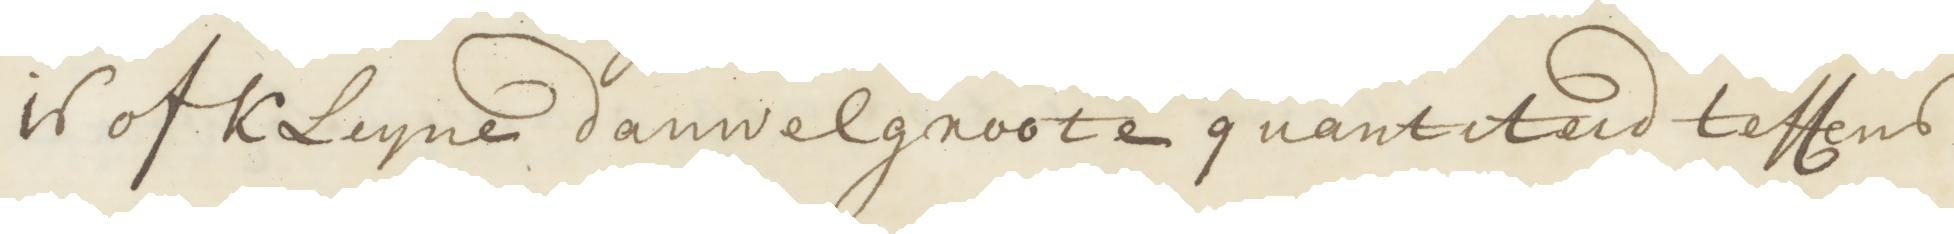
is of kleyne danwelgroote quantiteid teffens
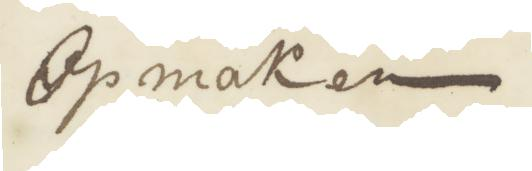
Opmaken
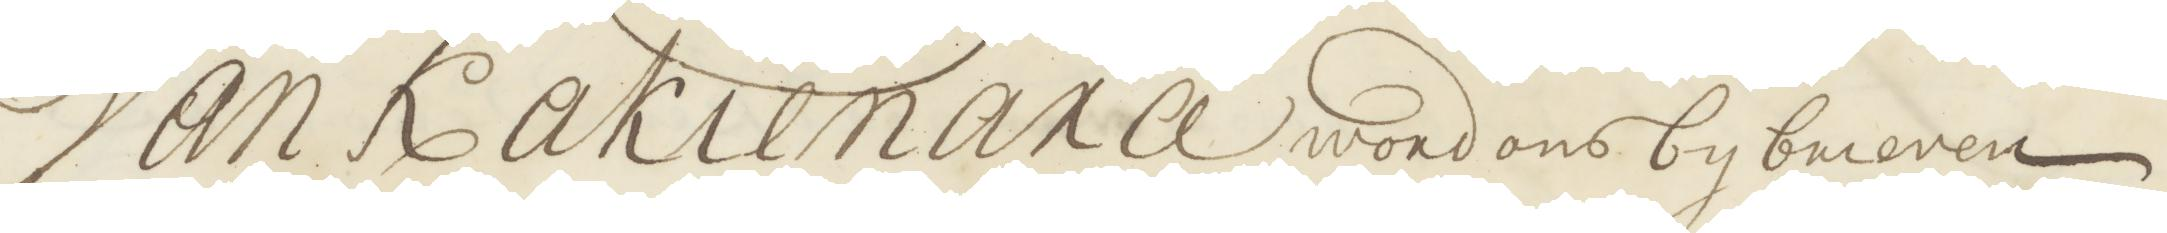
Van Kakienara word ons by brieven
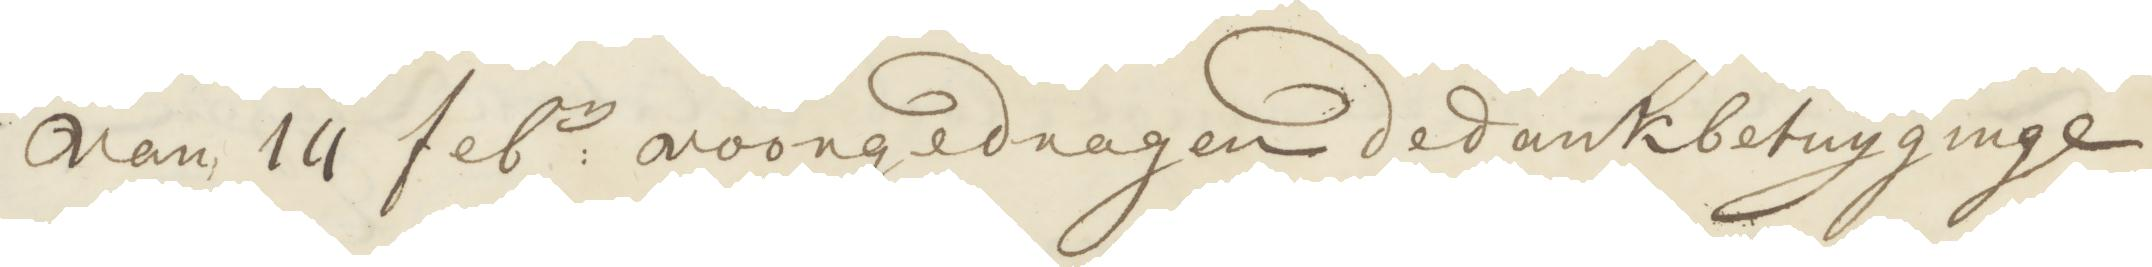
van 14 feb:r voorgedragen dedankbetuijginge
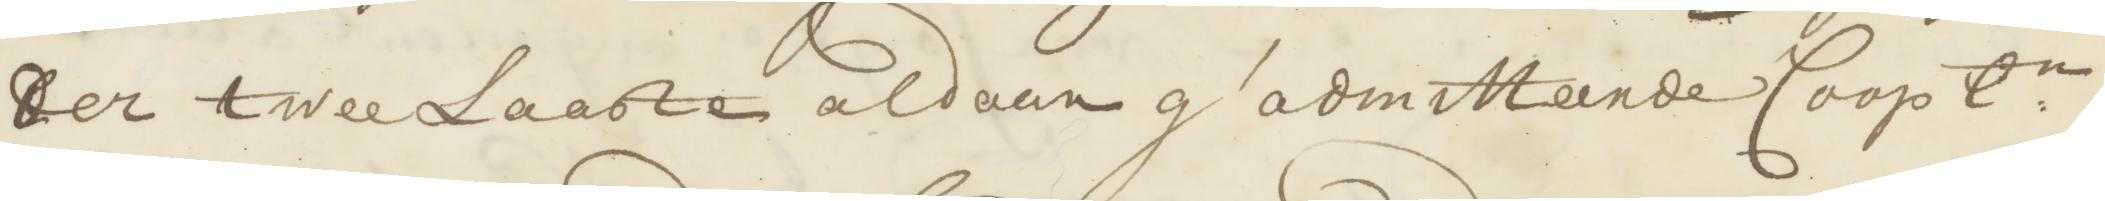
der twee Laaste aldaar g’admitteerde Coopl„n
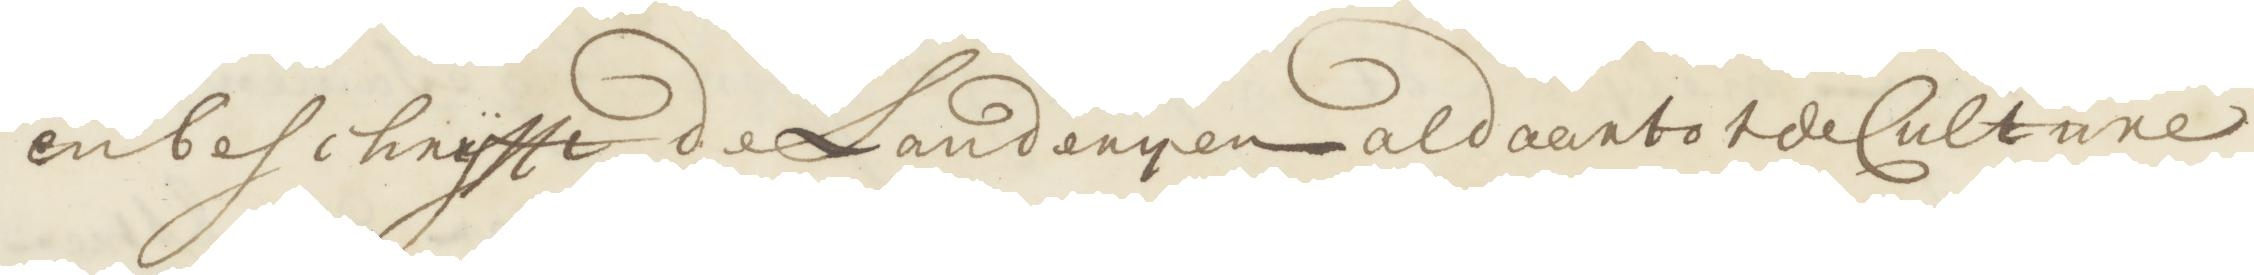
en beschrijfft de Landerijen aldaar tot de Culture
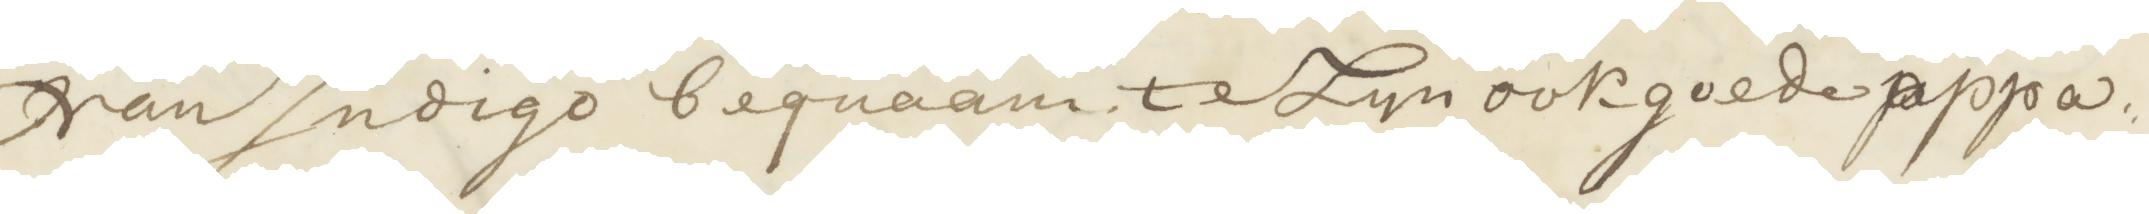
van Jndigo bequaam te zijn ook goede appa„
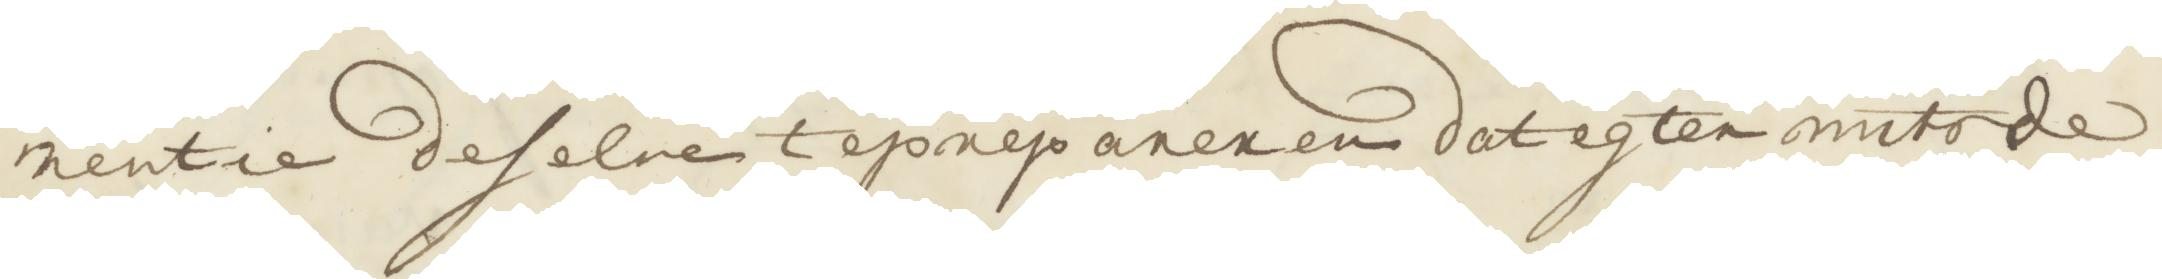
rentie deselve te prepareren dat egter mits de
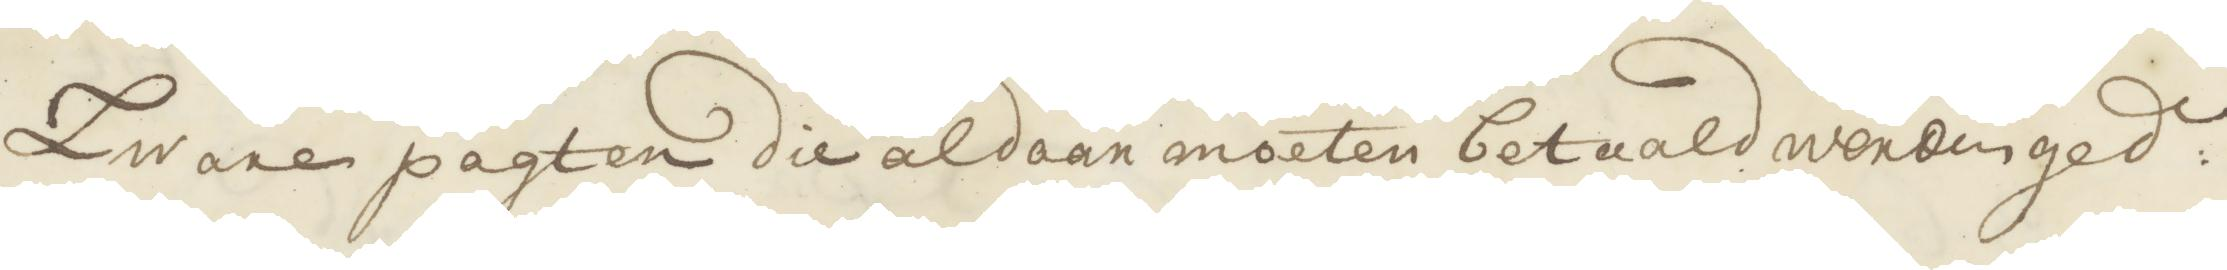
zware pagten die aldaar moeten betaald werden ged:
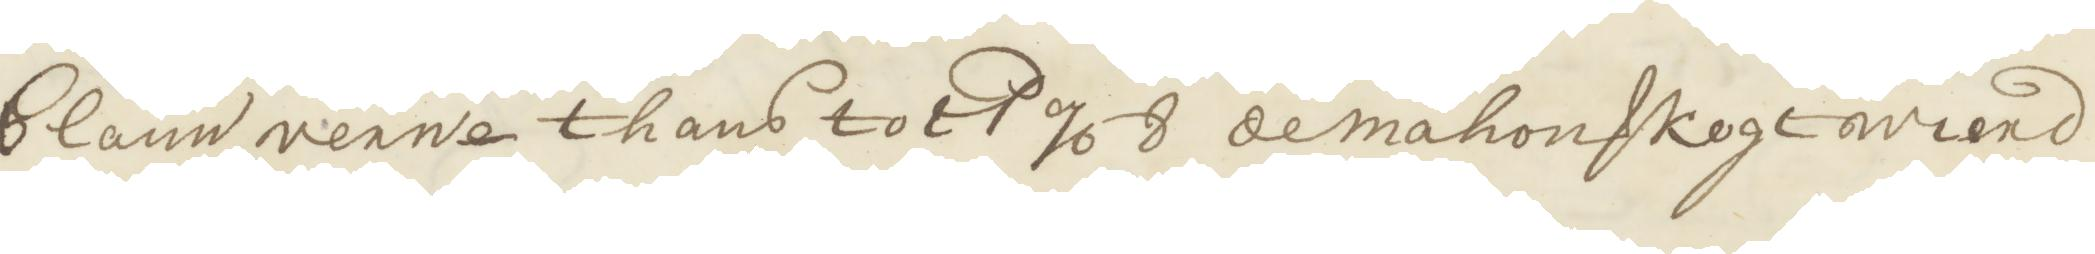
blauw verwe thans tot Pa/o 8 demahonverkogt wierd
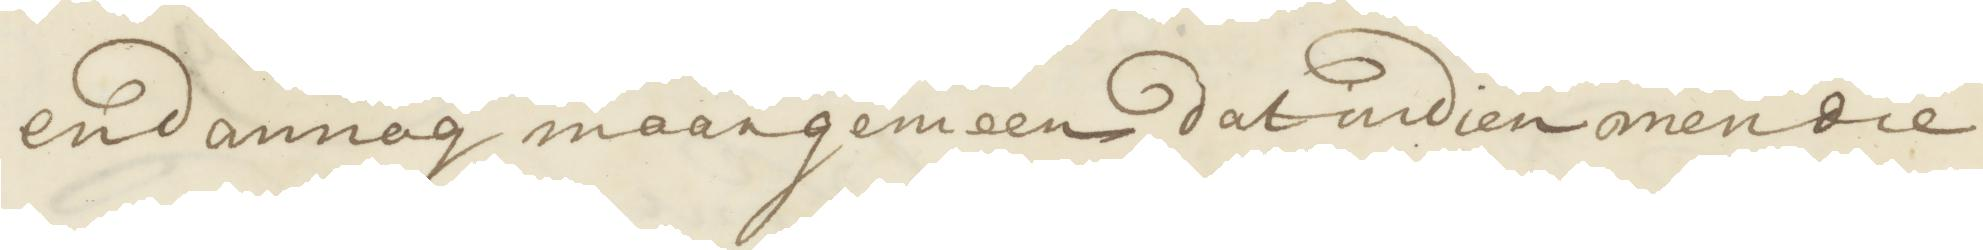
en dannog maargemeen dat indien men die
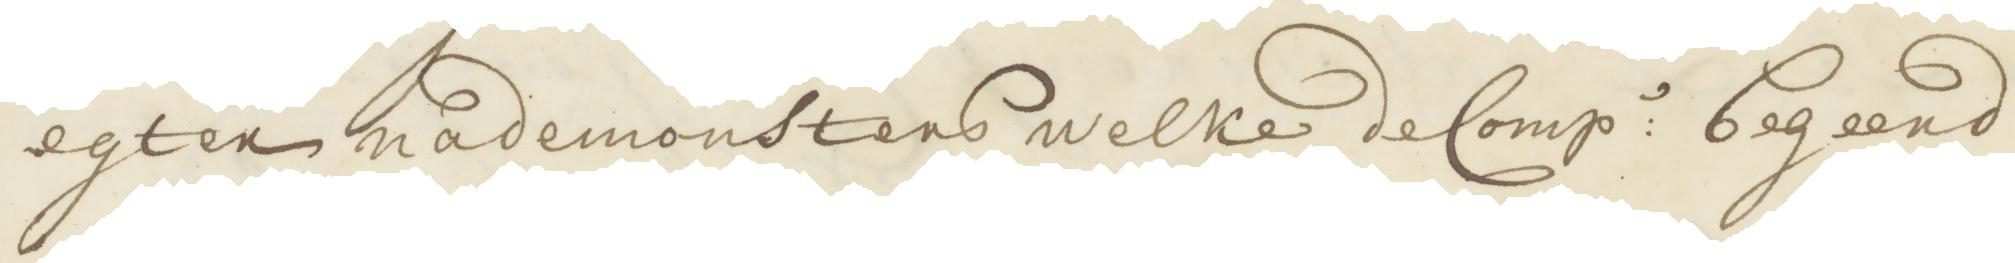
egter nademonsters welke de Comp: begeerd
